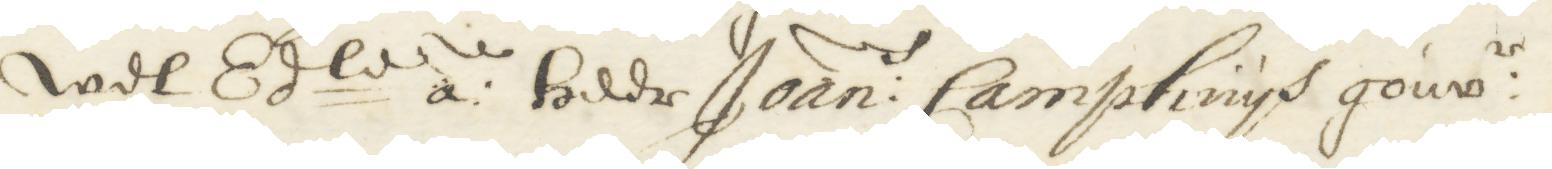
wel Ed=le a:e heer Joan:s Camphuijs gouv:r
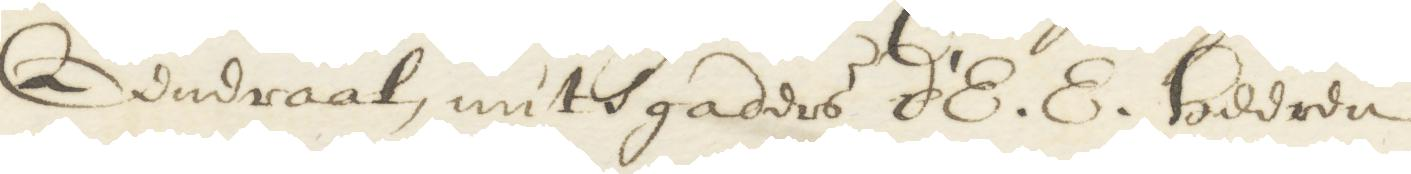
Generaal, mitsgaders d’E. E. Heeren
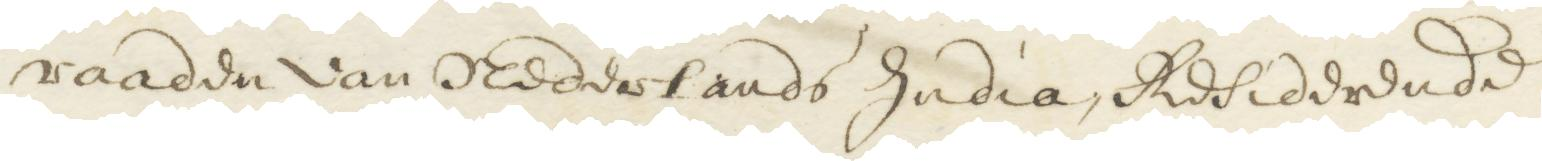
raaden van Nederlands Jndia, Residerende
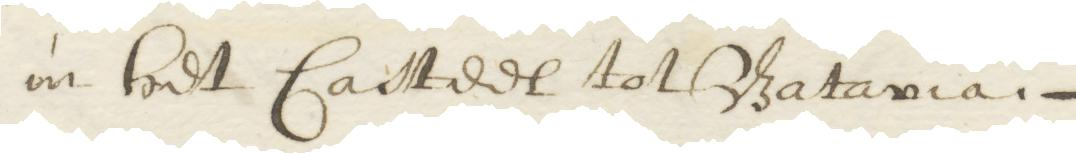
in het Casteel tot Batavia.
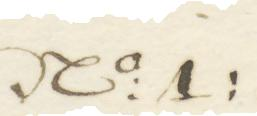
N:o 1:
